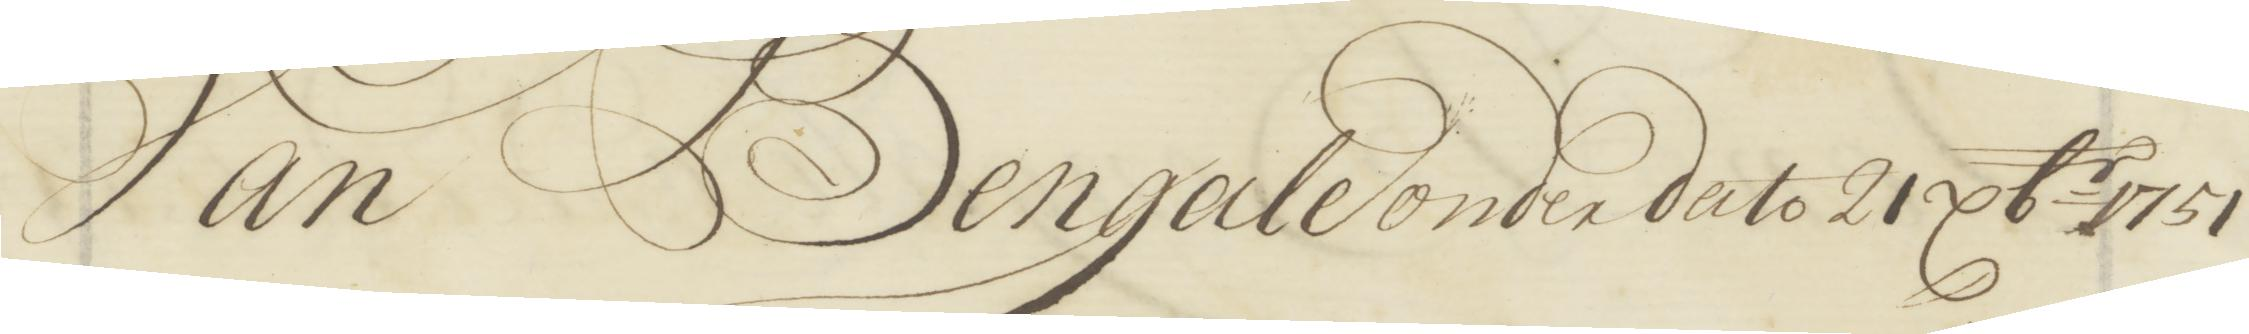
Van Bengale onder dato 21 xb=r 1751
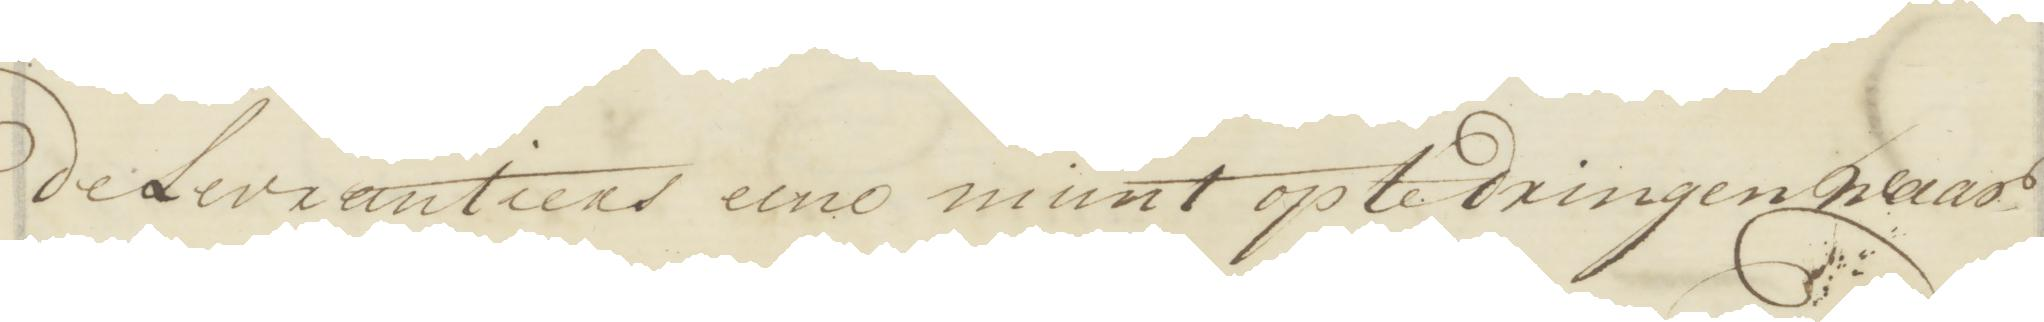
de Levrantiers eene munt op te dringen waar
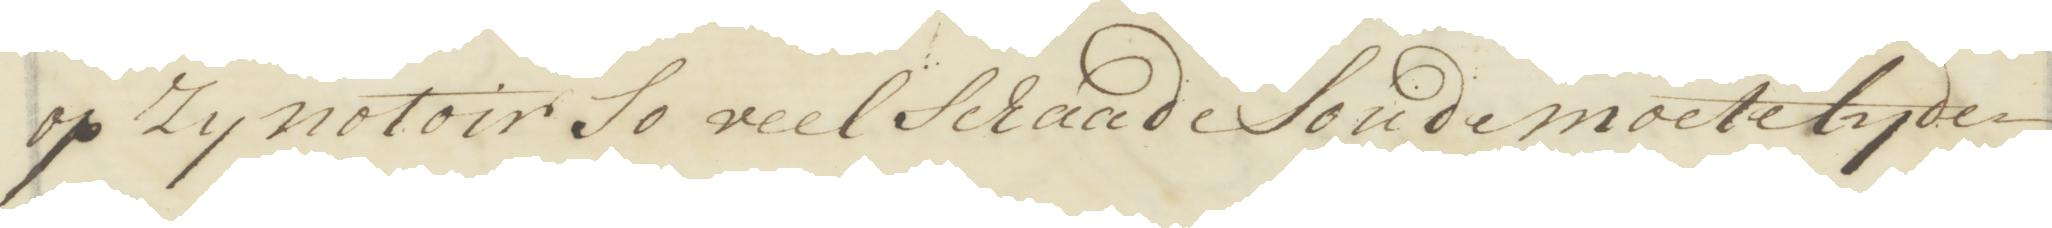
op Zy notoir So veel Schaade Soude moete lyden
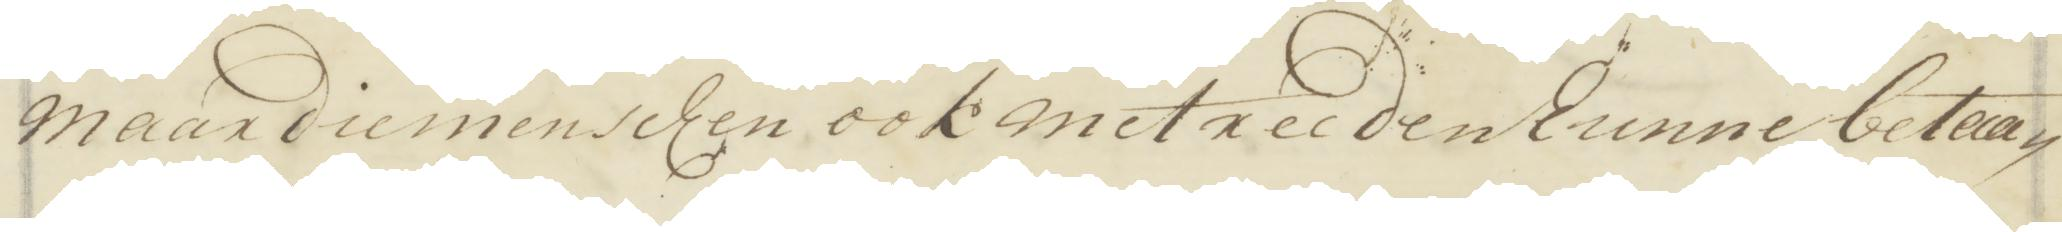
maar die menschen ook met reeden hunne betaa
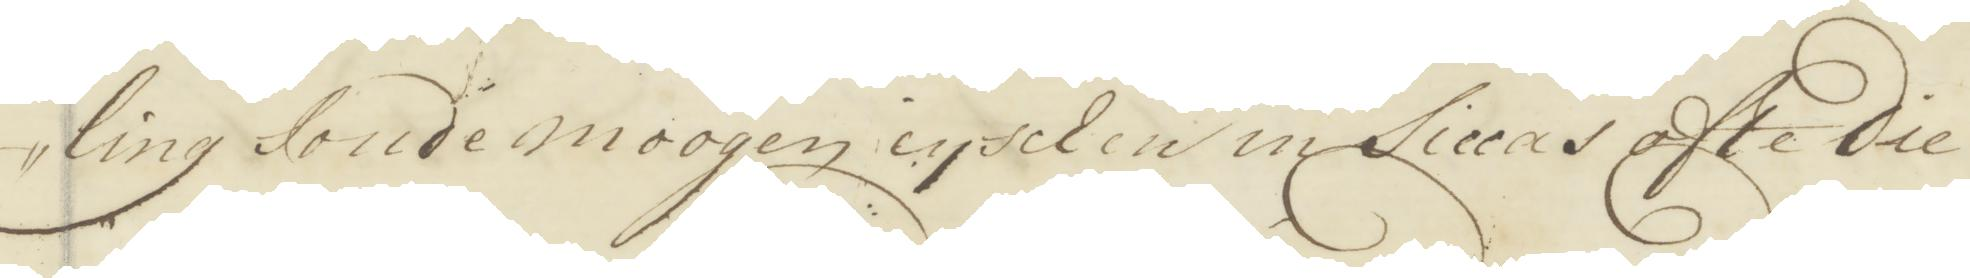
„ling Soude moogen eyschen in Siccas ofte die
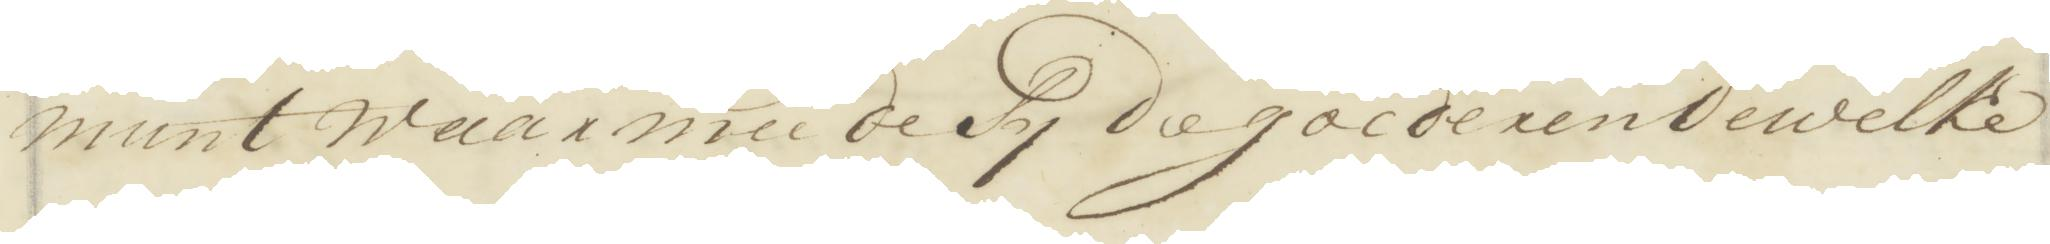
munt waar meede Sy die goederen dewelke
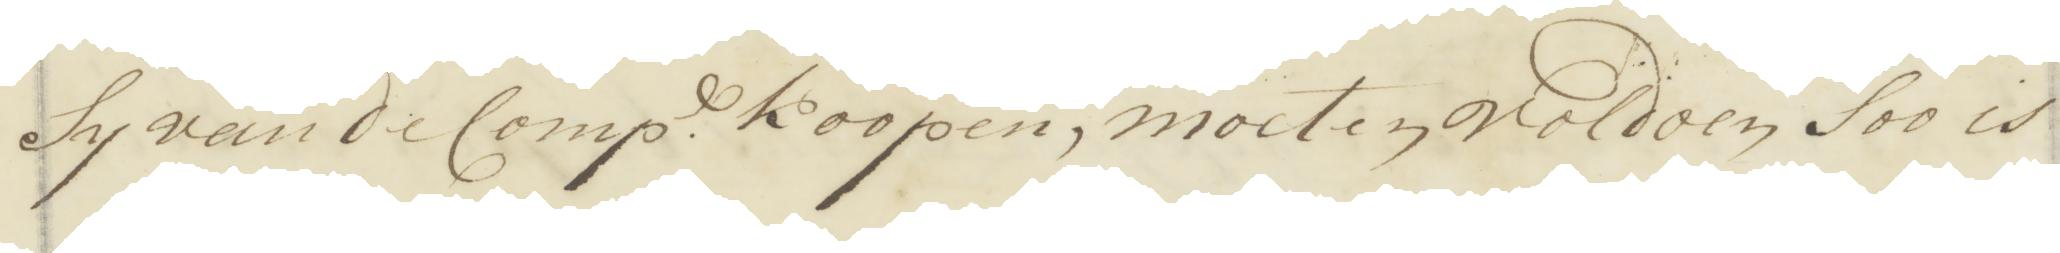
Sy van de Comp.e koopen, moeten voldoen Soo is
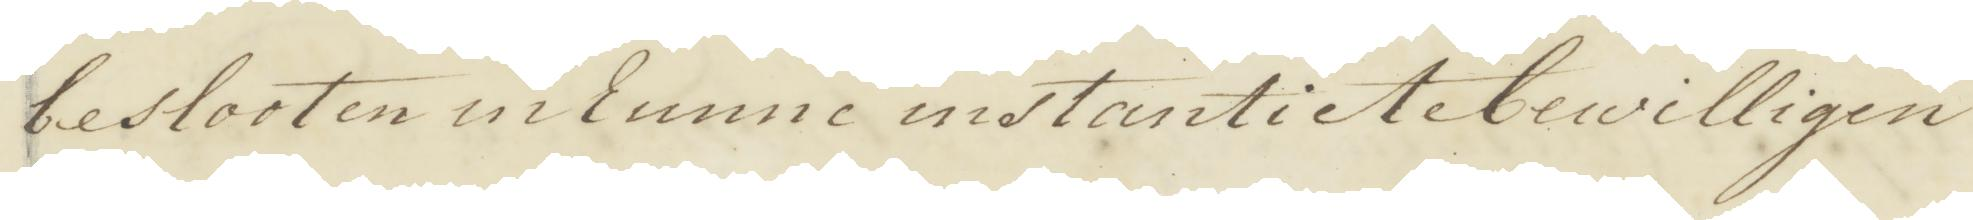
beslooten in hunne instantie te bewilligen
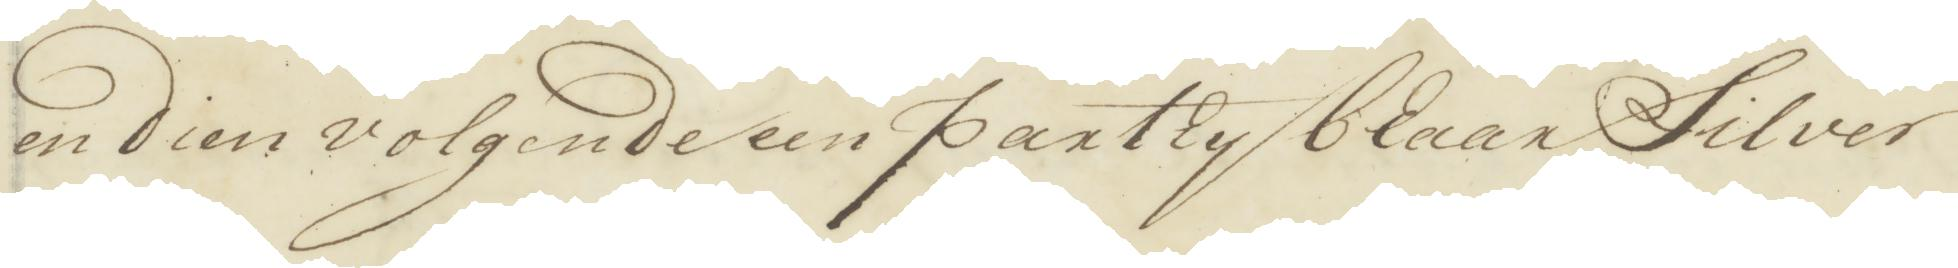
en dien volgende een parthy bhaar Silver
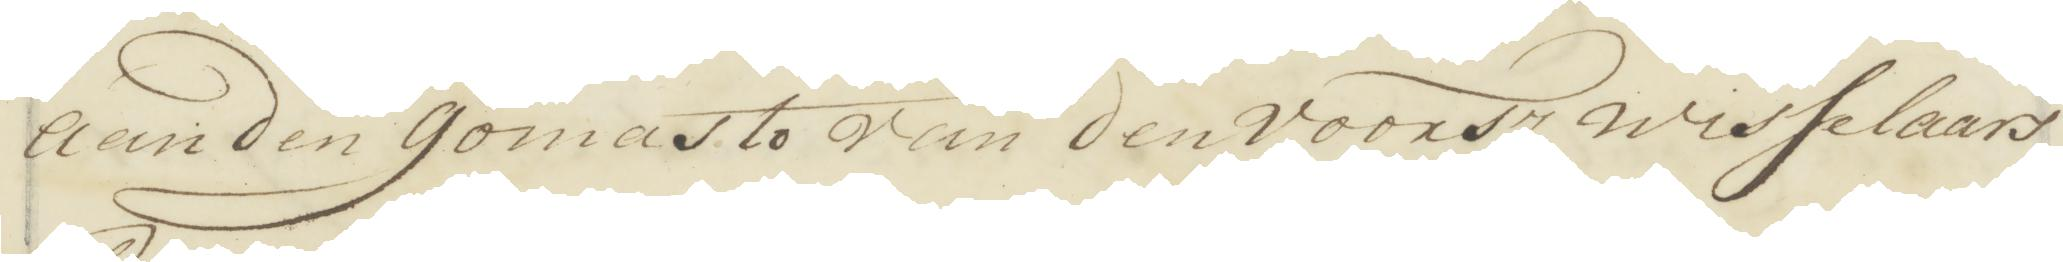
aan den gomasto van den voorsz wisselaars
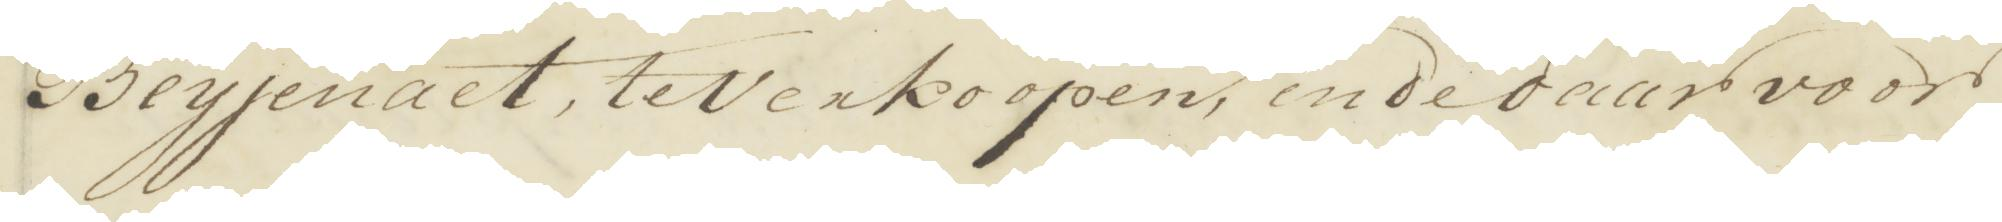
Beyjenaet, te Verkoopen, ende daar voor
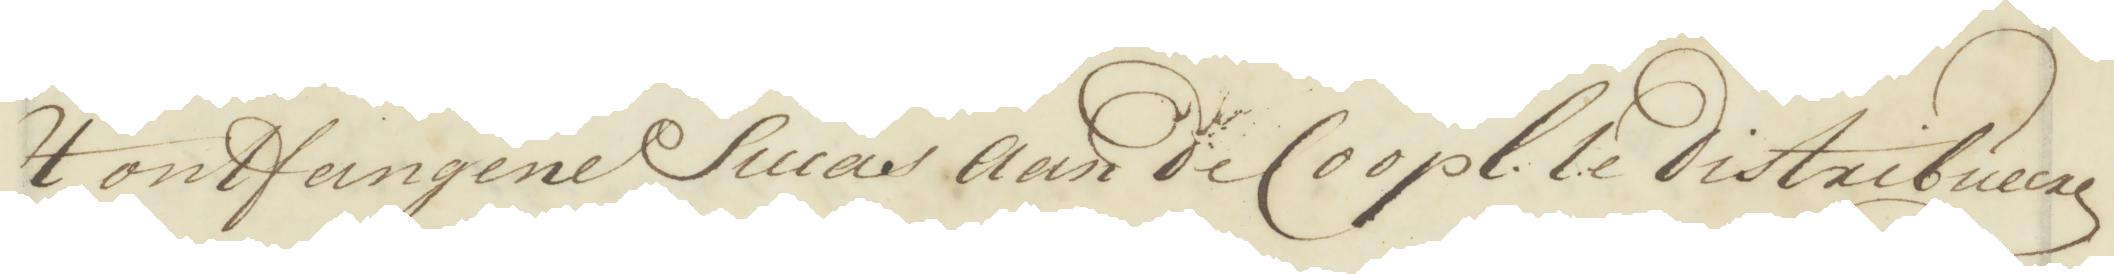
’t ontfangene Siccas aan de Coopl. te distribueeren
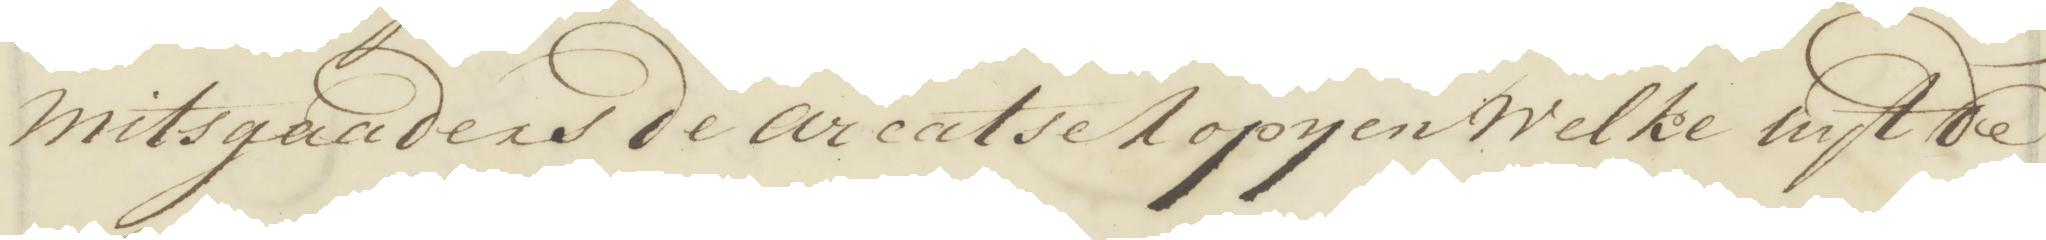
mitsgaaders de arcatse ropyen welke uyt die
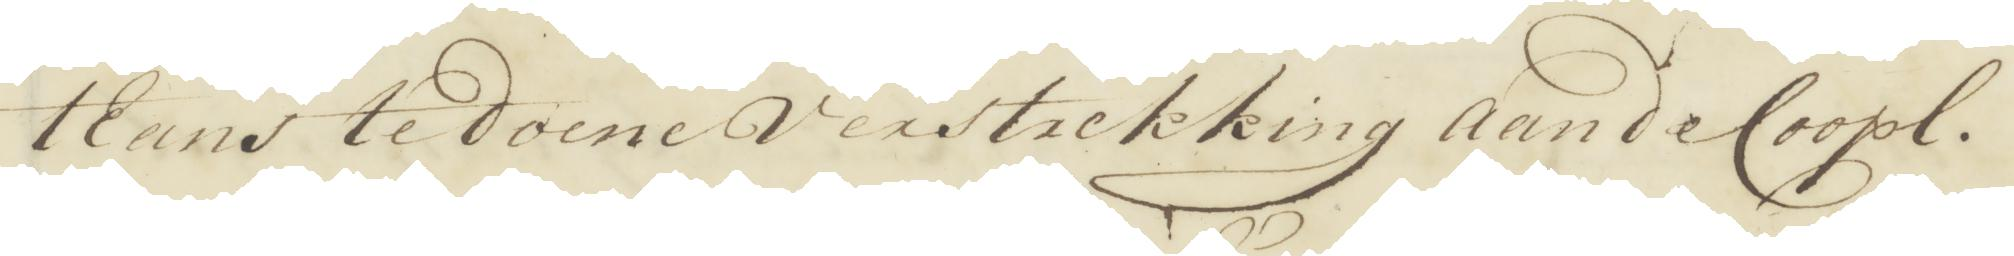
thans te doene verstrekking aan de Coopl.
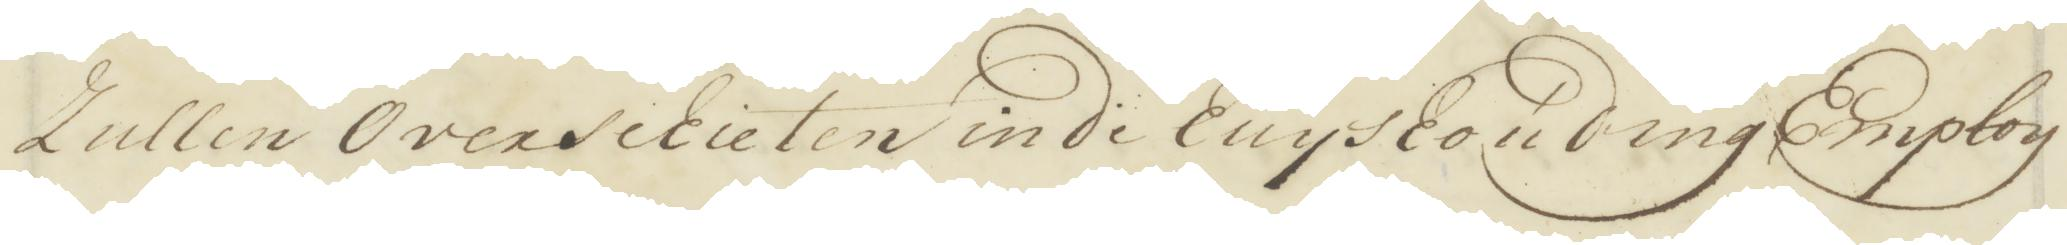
Zullen Overschieten in de huyshouding Employ
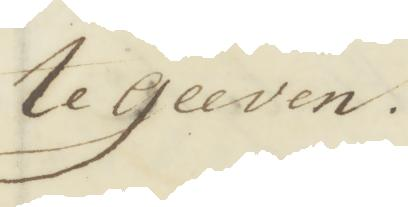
te geeven.
